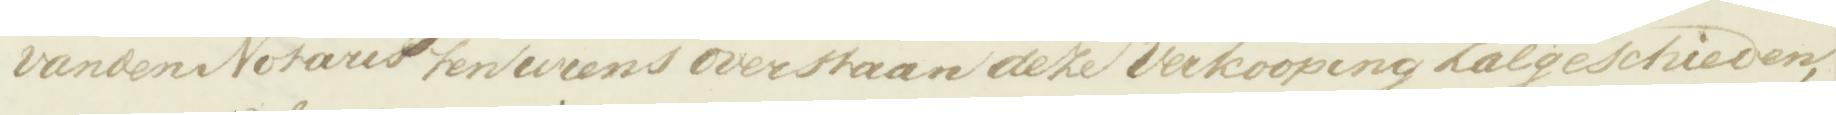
vanden Notaris ten wiens overstaan deze verkooping zal geschieden,
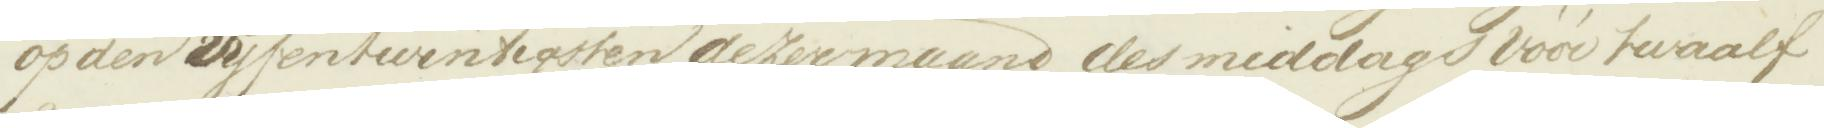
op den Vyfentwintigsten dezer maand, des middags voor twaalf
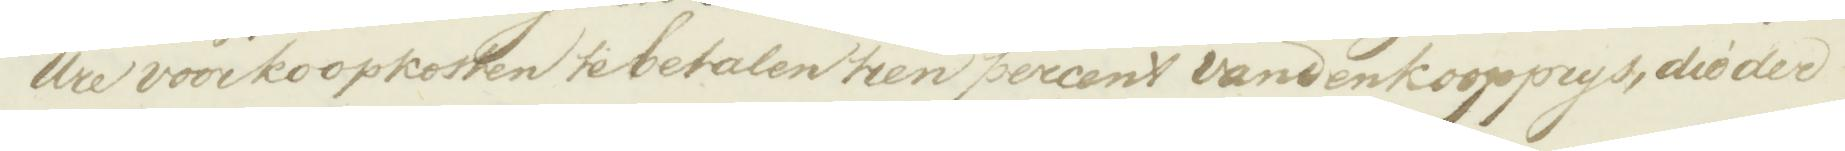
Ure voor koopkosten te betalen tien percent vanden koopprys, die der
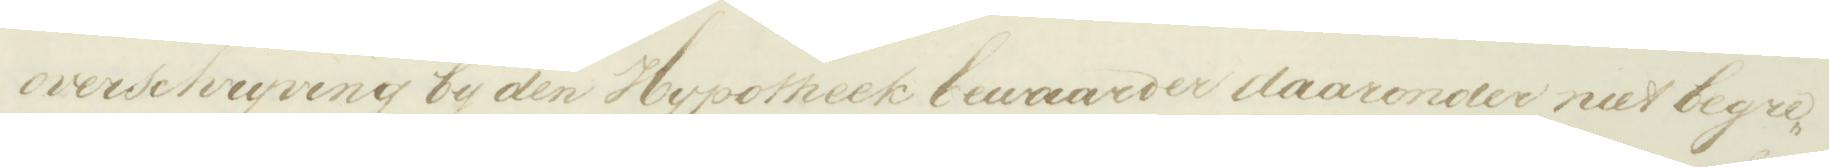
overschryving by den Hypotheek bewaarder daaronder niet begre„
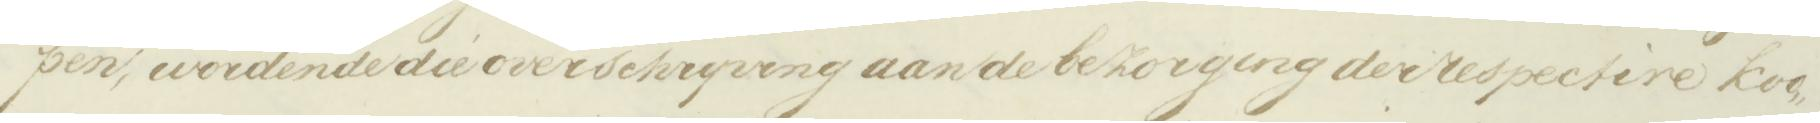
pen, wordende die overschryving aan de bezorging der respective koo„
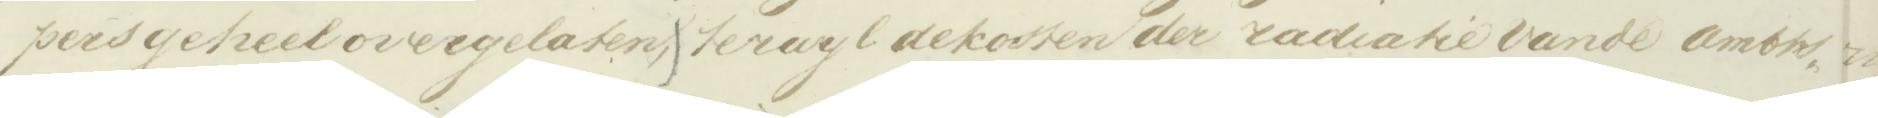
pers geheel overgelaten, terwyl de kosten der radiatie vande ambts,
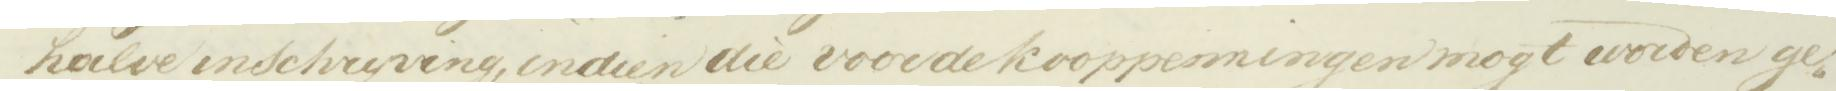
halve inschryving, indien die voor de kooppenningen mogt worden ge„
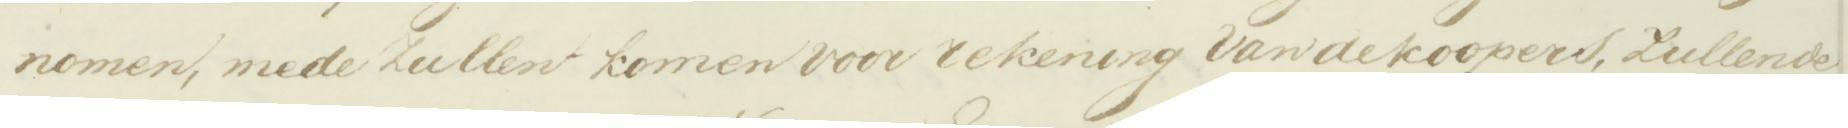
nomen, mede zullen komen voor rekening van de koopers, zullende
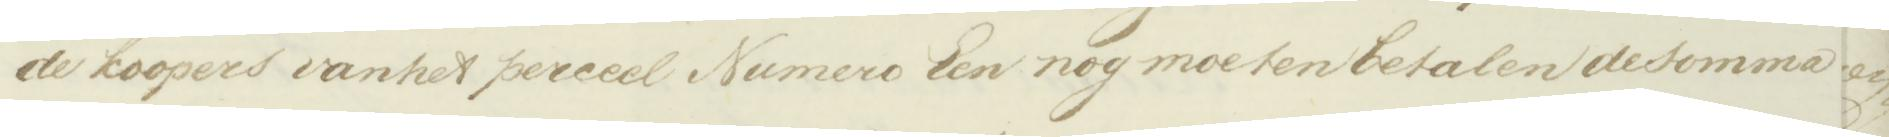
de koopers van het perceel Numero Een nog moeten betalen de somma en
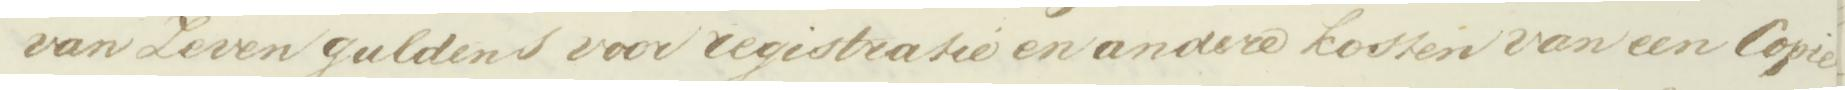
van Zeven guldens voor registratie en andere kosten van een Copie
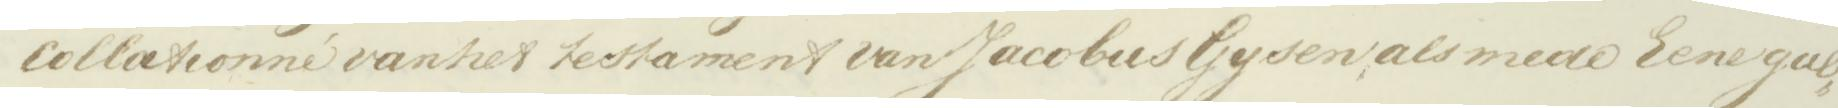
collationne van het testament van Jacobus Gysen, als mede Eene gul„
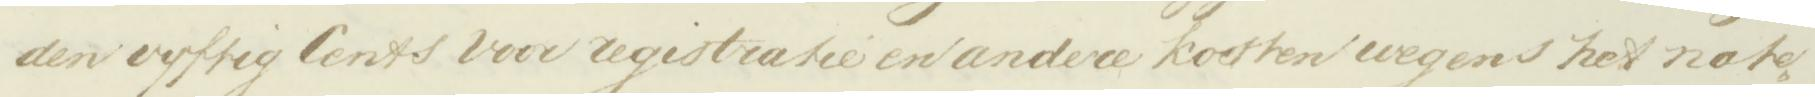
den vyftig Cents voor registratie en andere kosten wegens het nate„
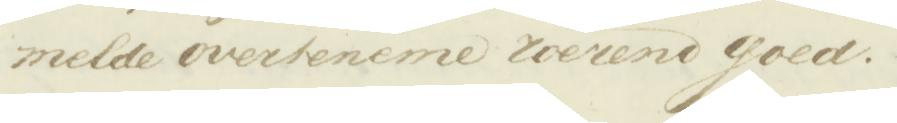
melde overteneme roerend goed.
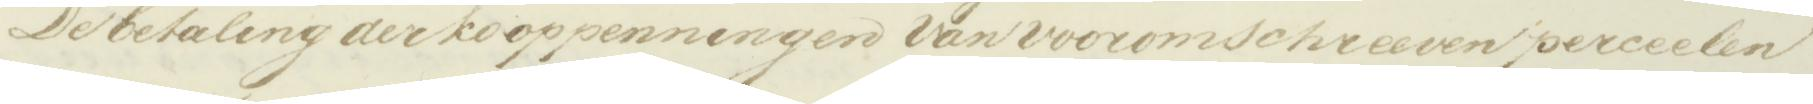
De betaling der kooppenningen van vooromschreeven perceelen
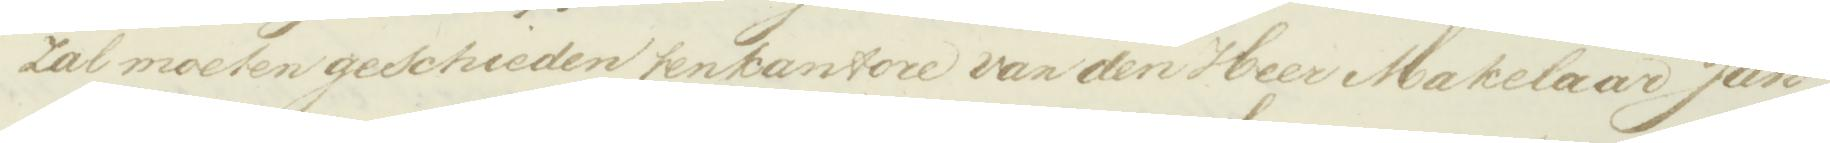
zal moeten geschieden ten kantore van den Heer Makelaar Jan
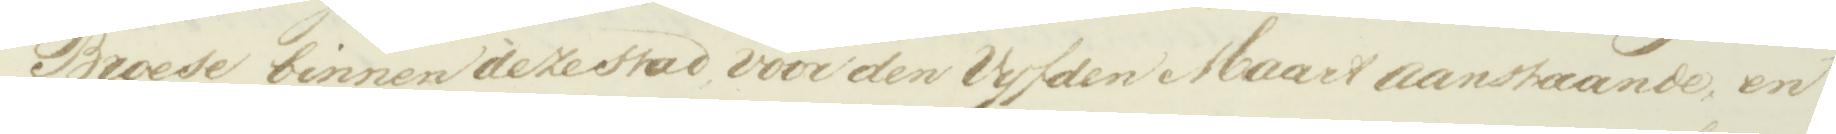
Broese binnen deze stad, voor den Vyfden Maart aanstaande, en
